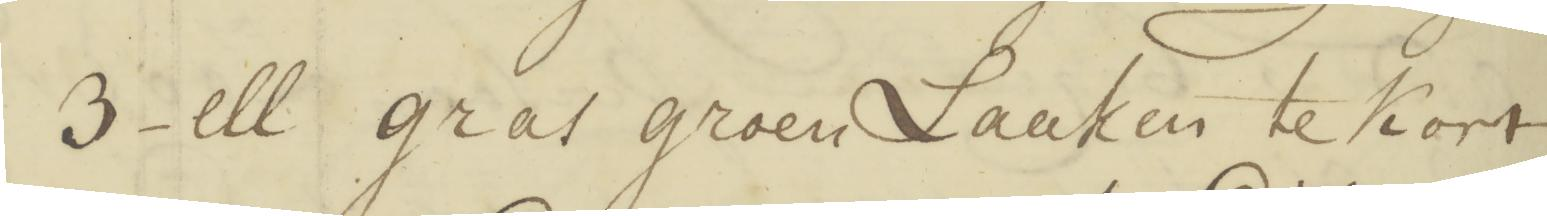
3 - ell gras groen Laaken te kort
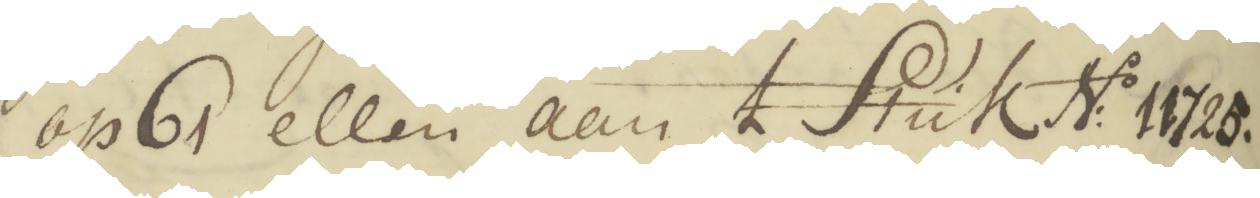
op 61 ellen aan t Stuk N:o 11725
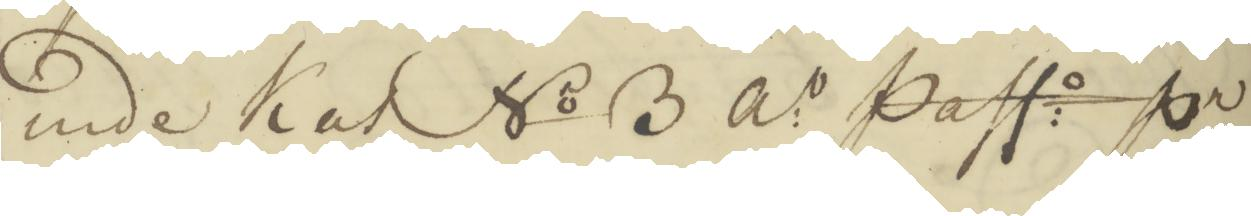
inde kas N-o 3 a:o pass:o pr
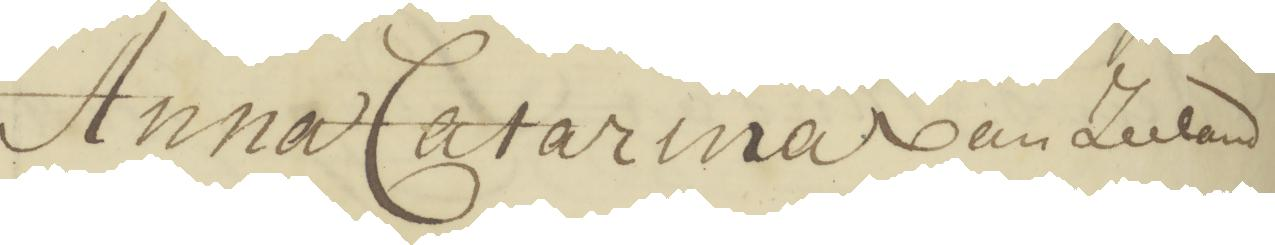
Anna Catarina van Zeeland
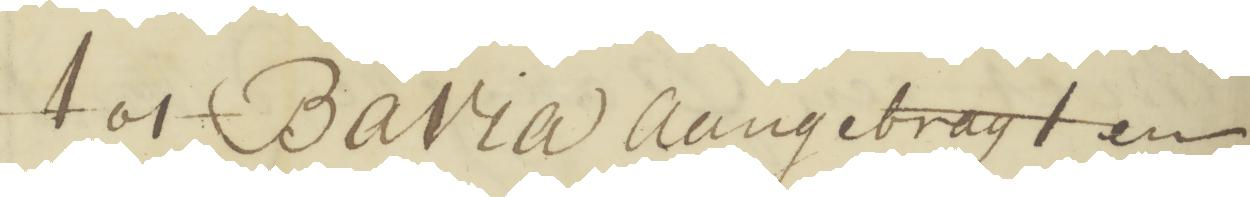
tot Bavia aangebragt en
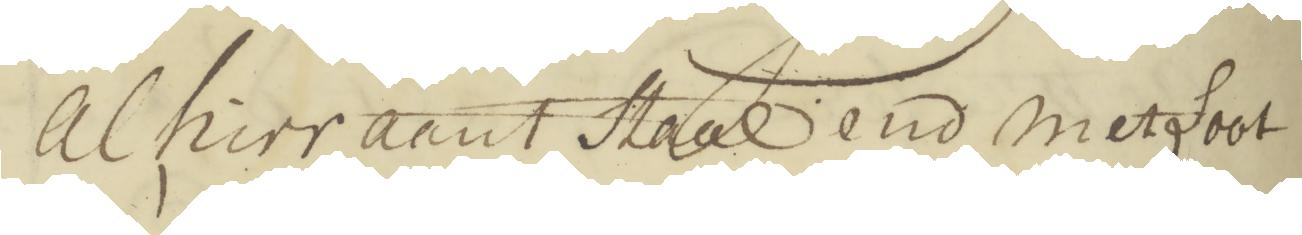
alhier aant staal end met Loot
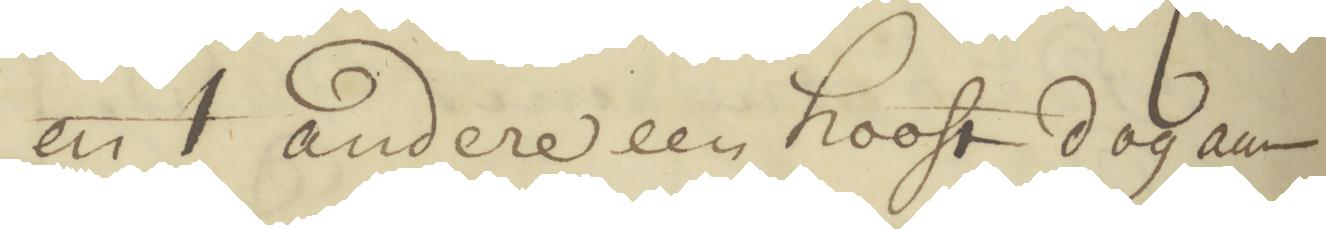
en 't andere een hooft dog aan
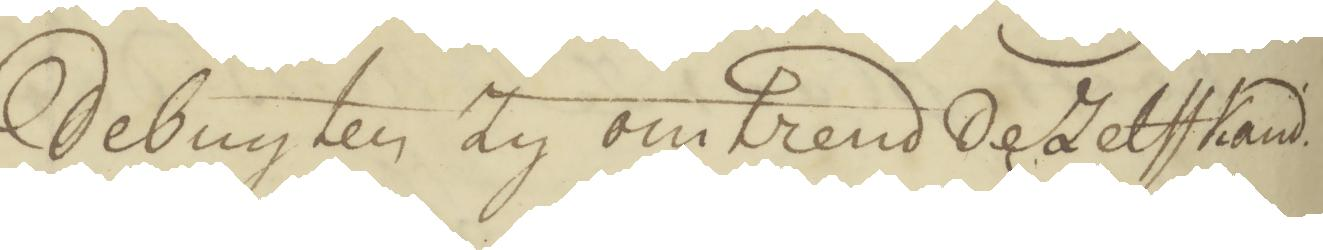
debuyten zy omtrend de zelff kand.
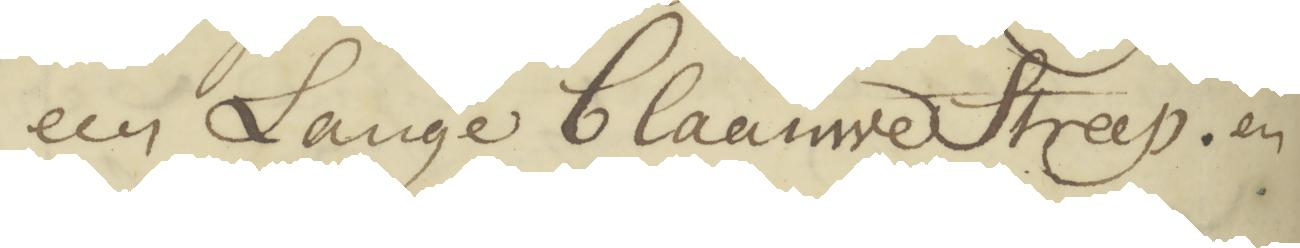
een Lange blaauwe Streep. en
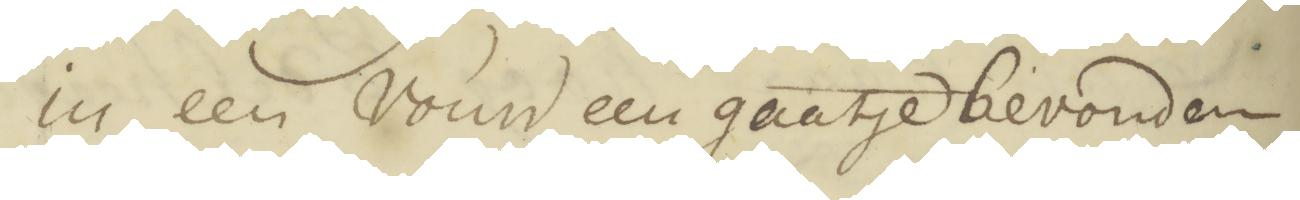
in een vouw een gaatje bevonden
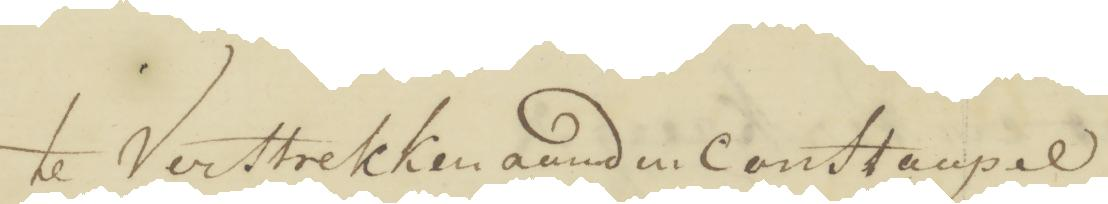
te Verstrekken aanden Constaapel
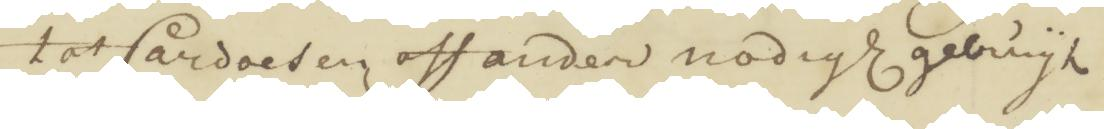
tot Cardoes en off ander nodigh gebruijk
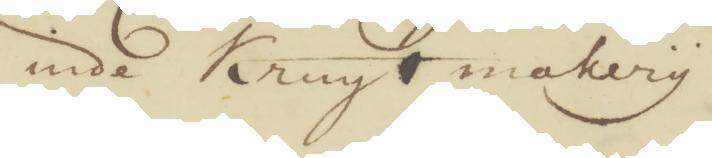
inde Kruyt makerij
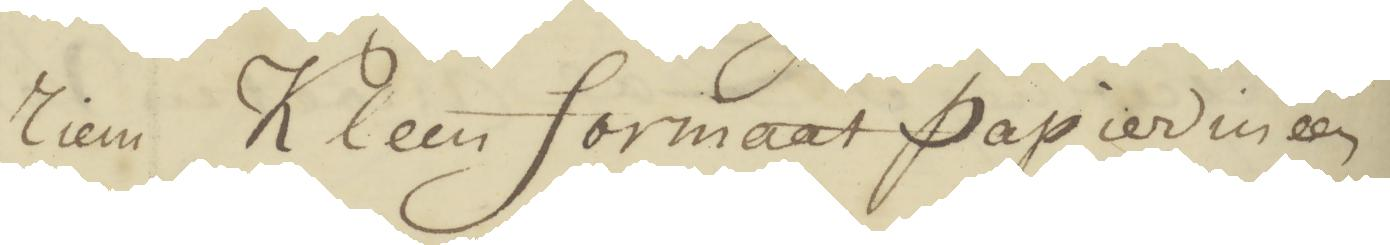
riem Kleen formaat Papier in een
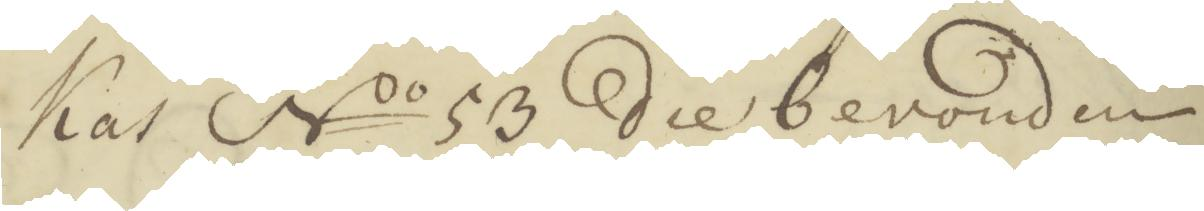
kas N=o 53 die bevonden
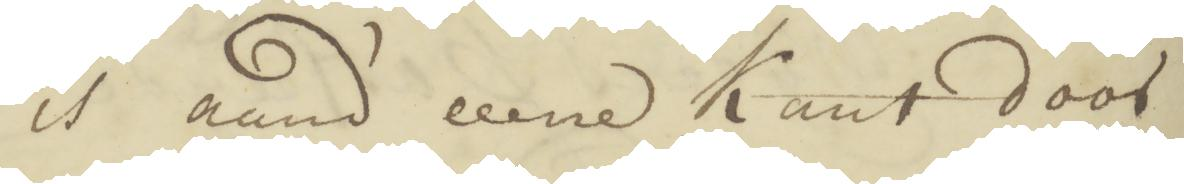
is aand' eeene kant door
